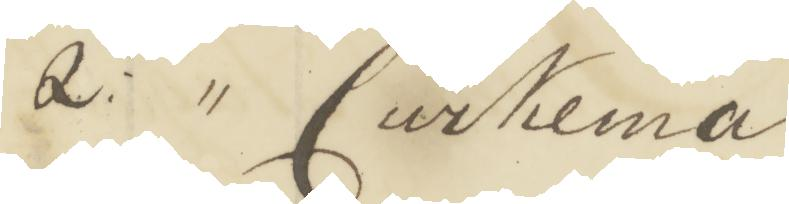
2: „ Curkema
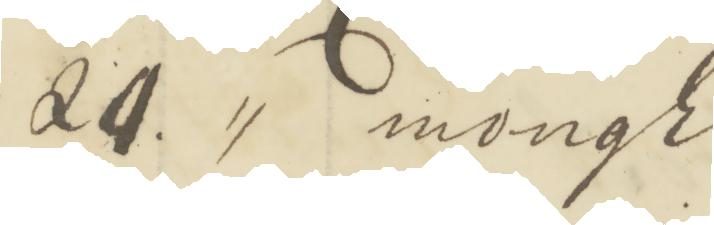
24. „ mongh
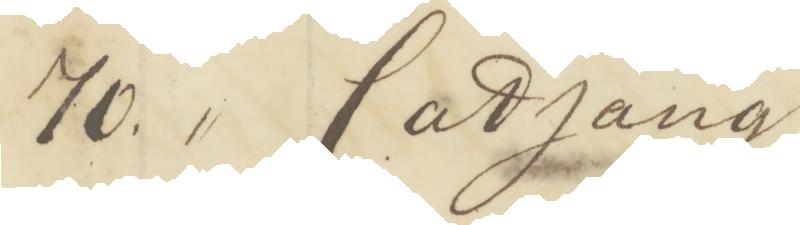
70. „ Cadjang
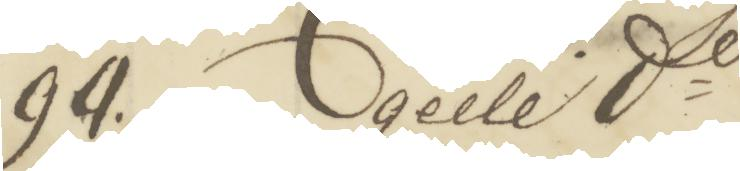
94. geele d=o
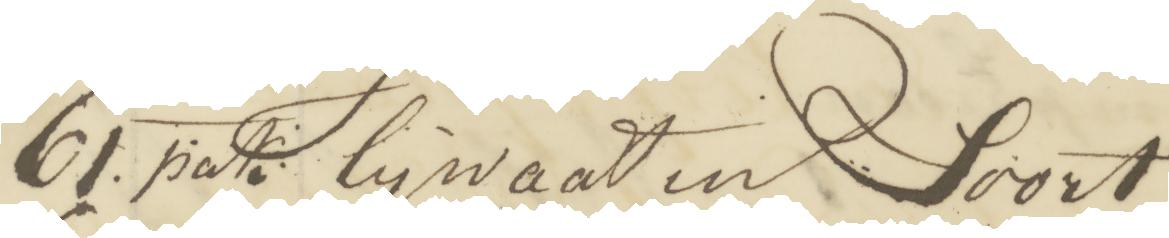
61. pak: lijwaat in Soort
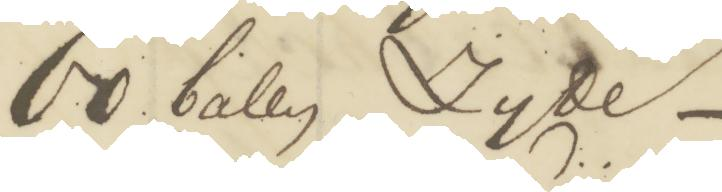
60. balen Zyde —=o
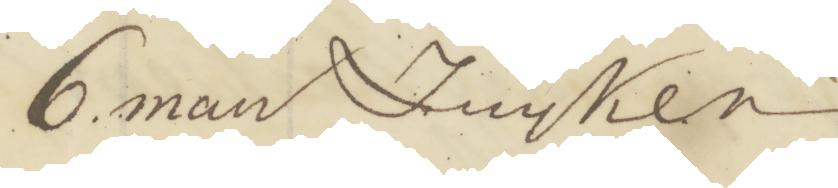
6. man Zuijker
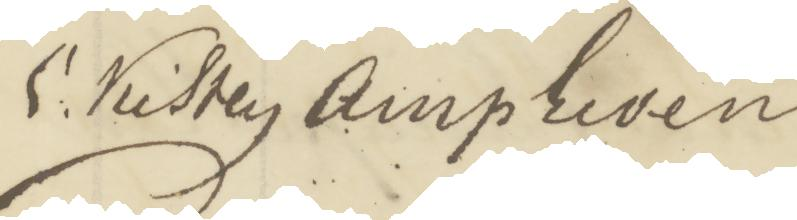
5: kisten Amphioen
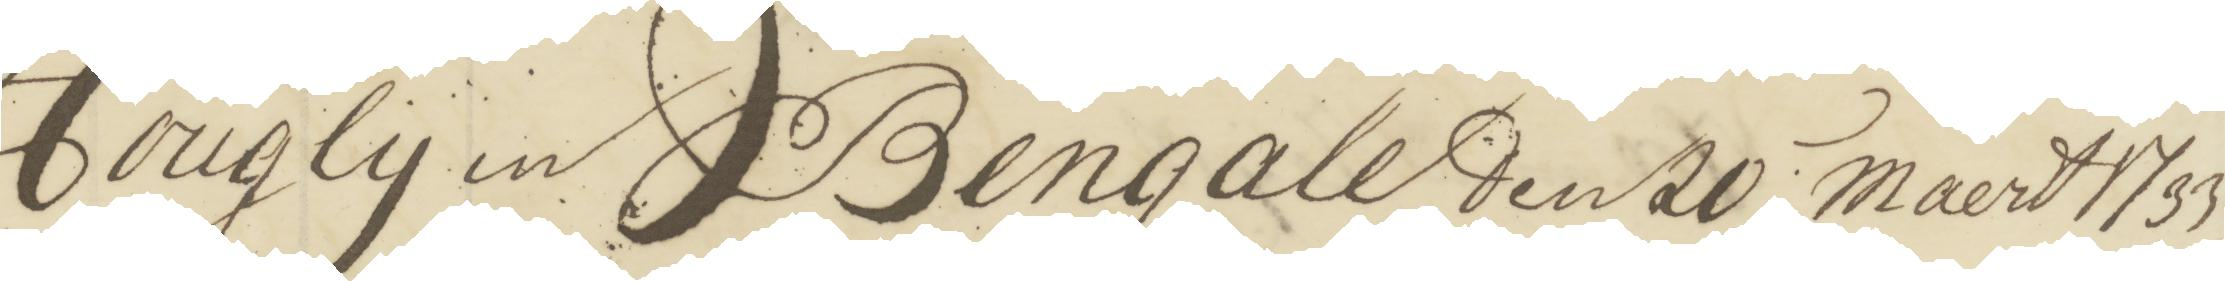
Houglij in Bengale den 20:' maert 1733
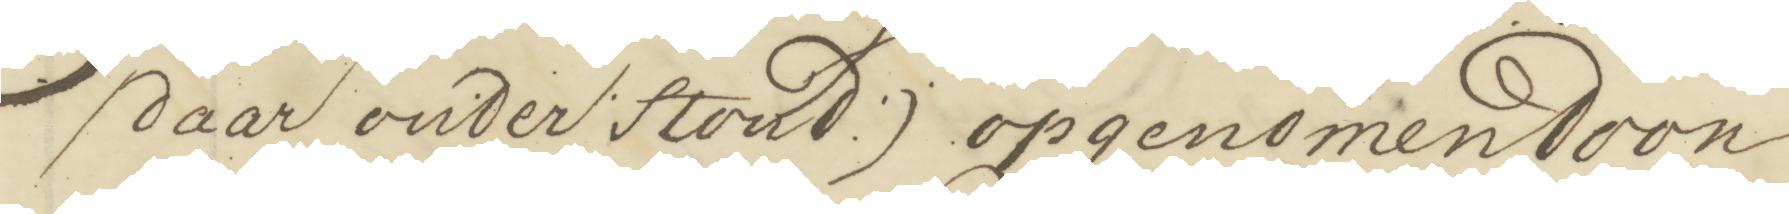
/daar onder stond: / opgenomen door
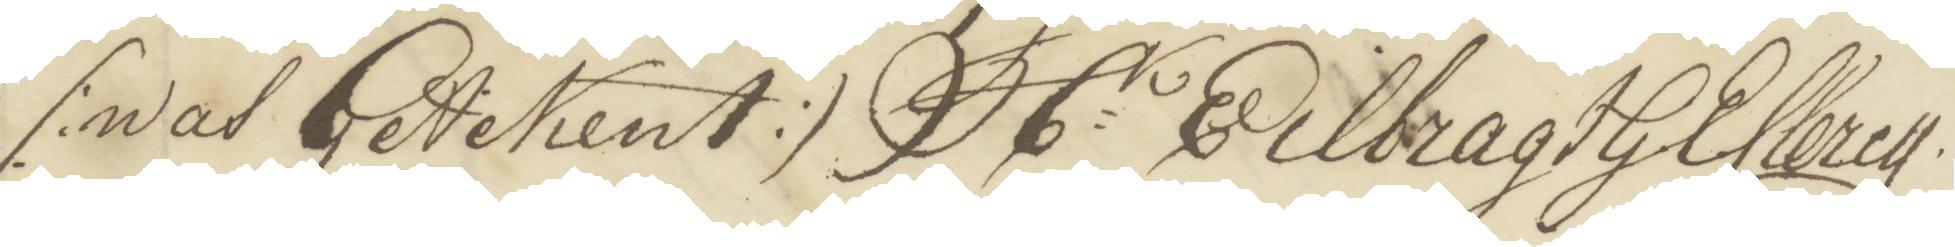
(:was Getekent:) H:K Eilbragt G.E.Clercq
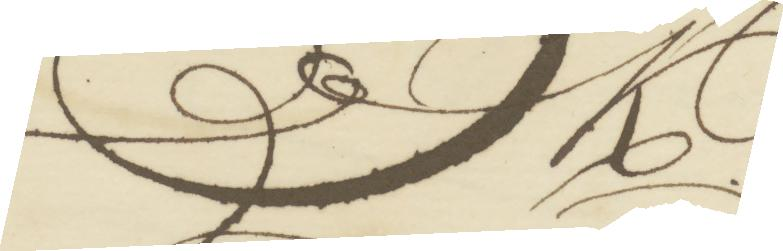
Ik.
